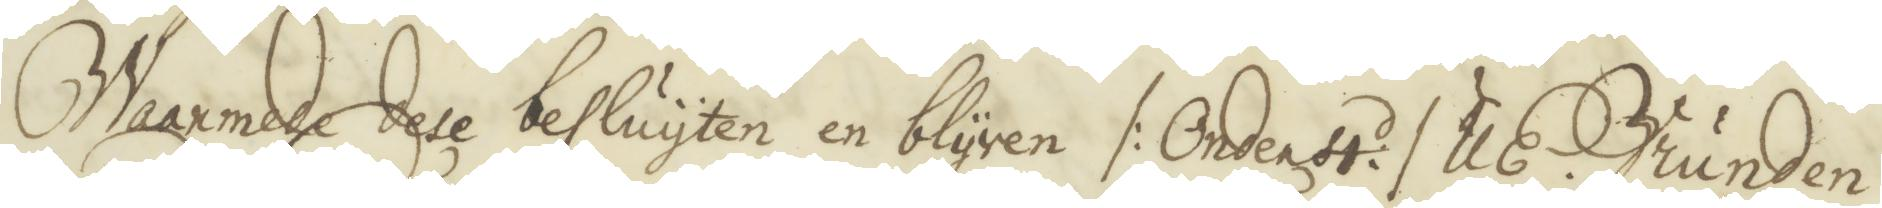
Waarmede dese besluijten en blijven /:onderst:d/ UE. Vrunden
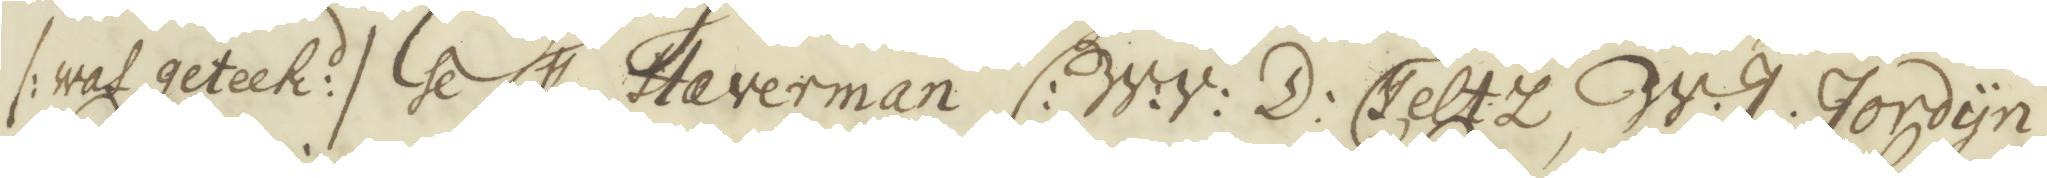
/:was geteek:d/ Ge F. Haverman, C:W:V: D: Feltz, W:J: Jordijn,
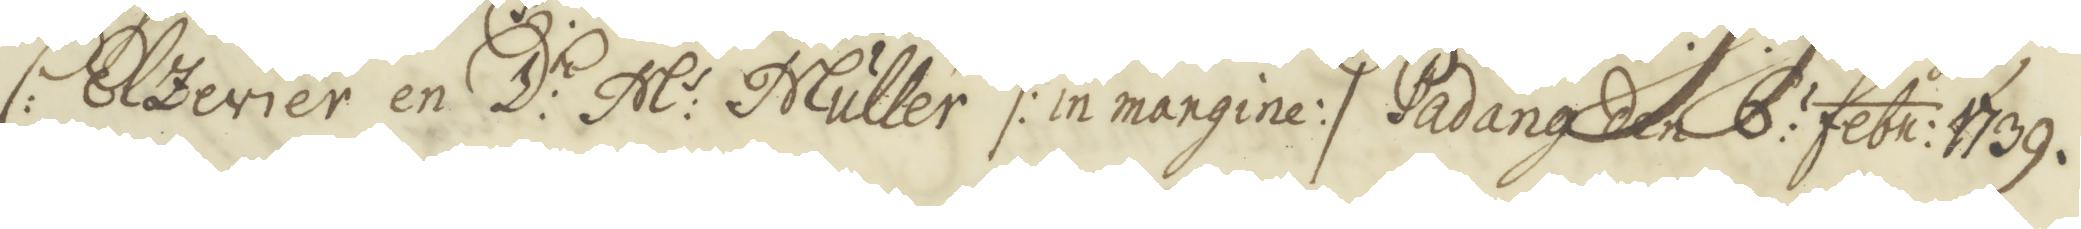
C: Elzevier en D:r M:s Muller /: in maringe :/ Padang den 6:' febr: 1739.
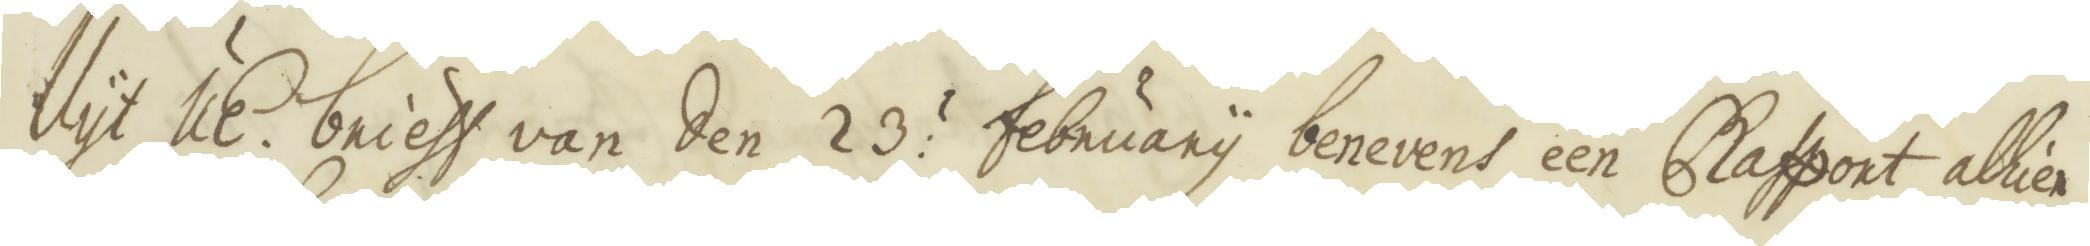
Uijt UE. brieff van den 23:' februarij benevens een Rapport alhier
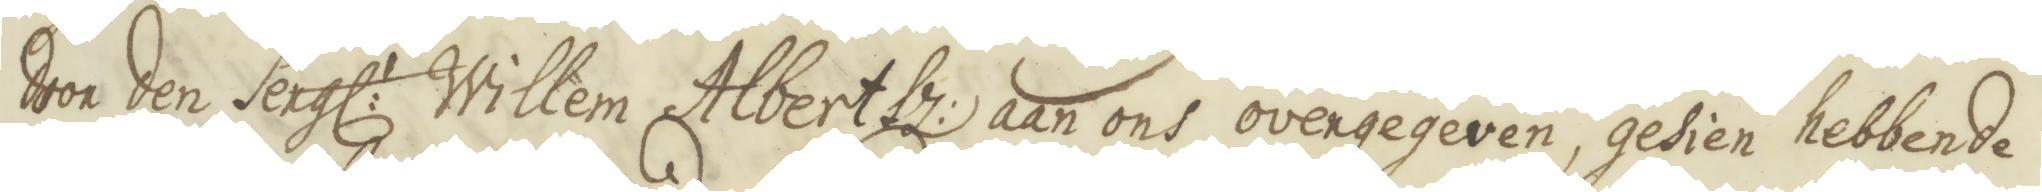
voor den serg:t Willem Albertsz: aan ons overgegeven, gesien hebbende
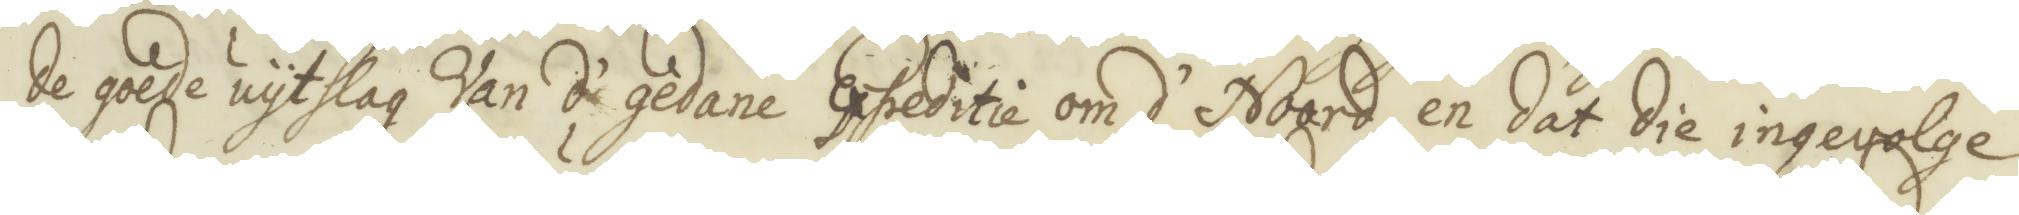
de goede uijtslag van d' gedane Expeditie om d’ Noord, en dat die ingevolge
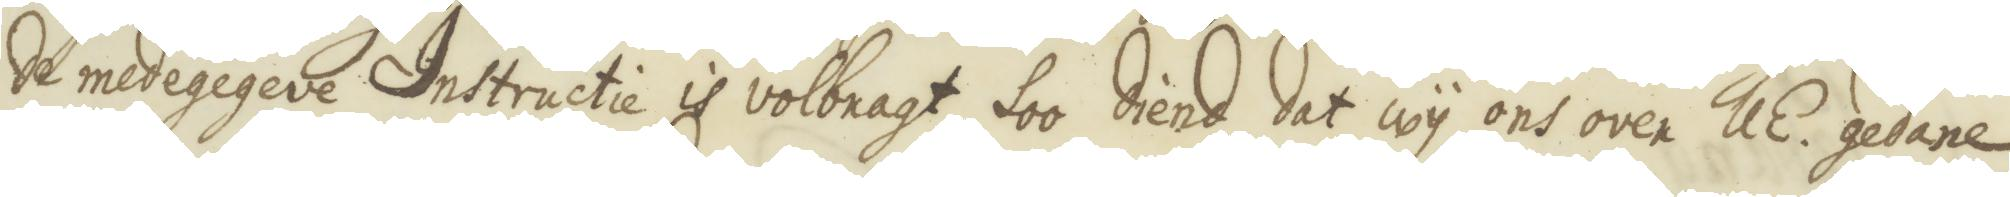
de medegegeve Jnstructie is volbragt, soo diend dat wij ons over UE. gedane
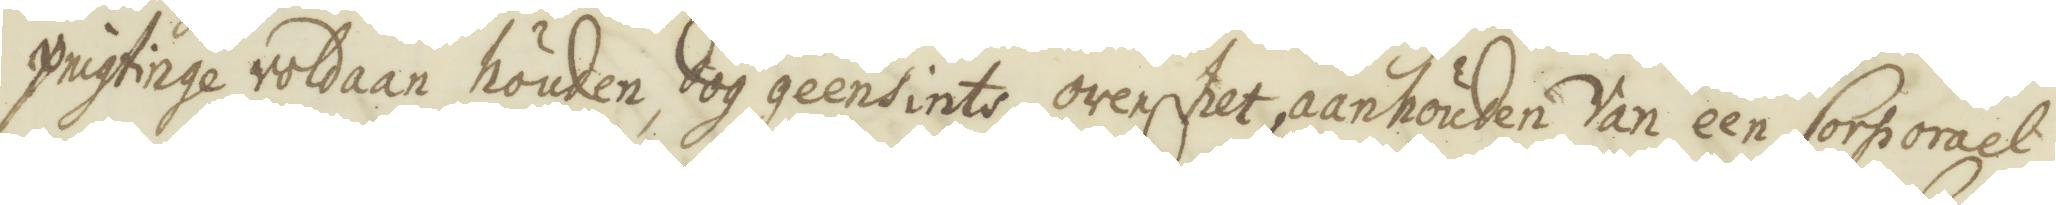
verrigtinge voldaan houden, dog geensints over het aanhouden van een Corporael
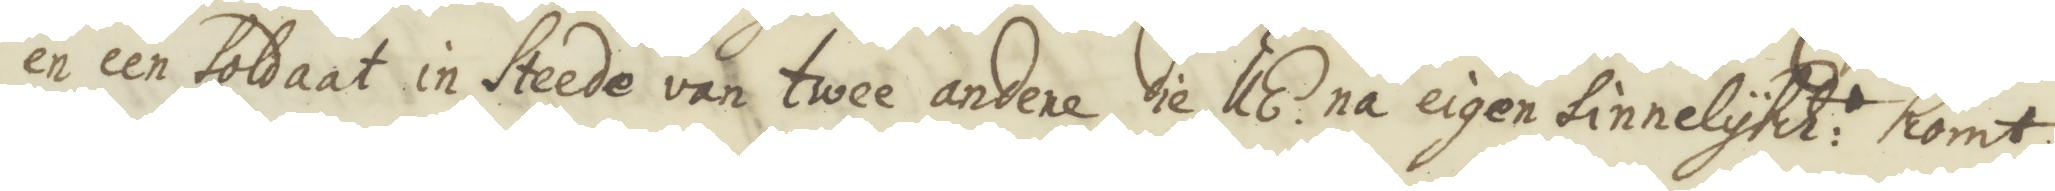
en een soldaat in steede van twee andere, die UE. na eigen sinnelijkh:t komt
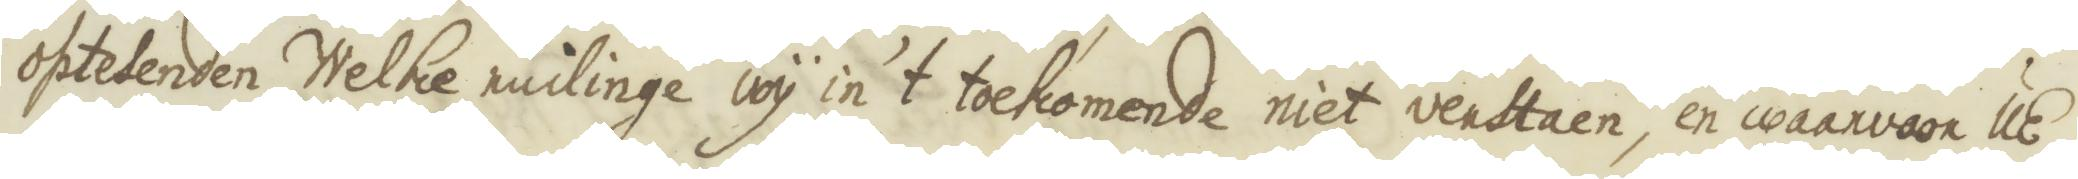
optesenden, welke ruilinge wij in ’t toekomende niet verstaen, en waarvoor UE.
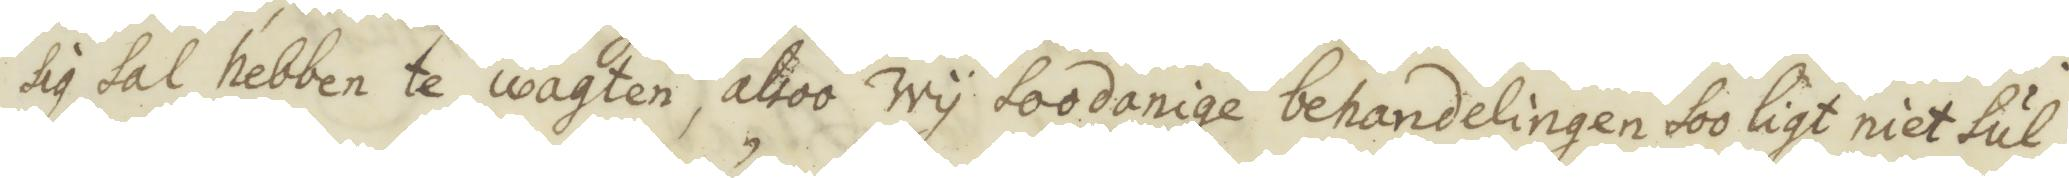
sig sal hebben te wagten, alsoo wij soodanige behandelingen soo ligt niet sul
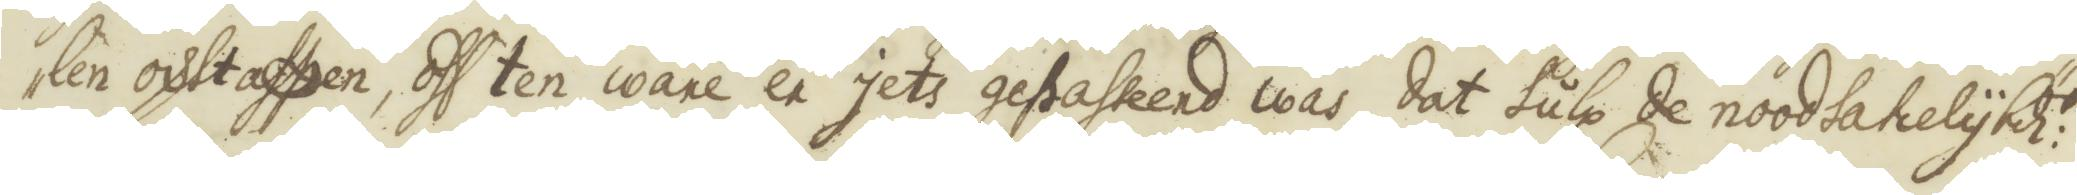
„len overstappen, off ten ware ’er jets gepasseerd was, dat sulx de noodsakelijkh:t
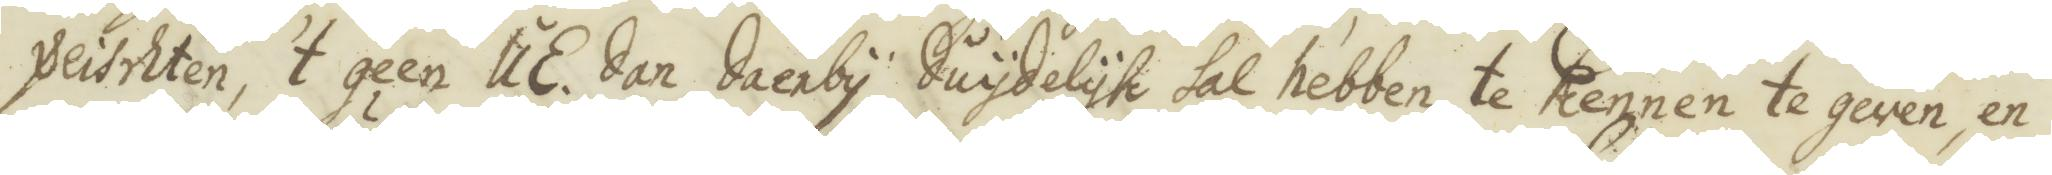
vereischten, ’t geen UE. dan daerbij duijdelijk sal hebben te kennen te geven, en
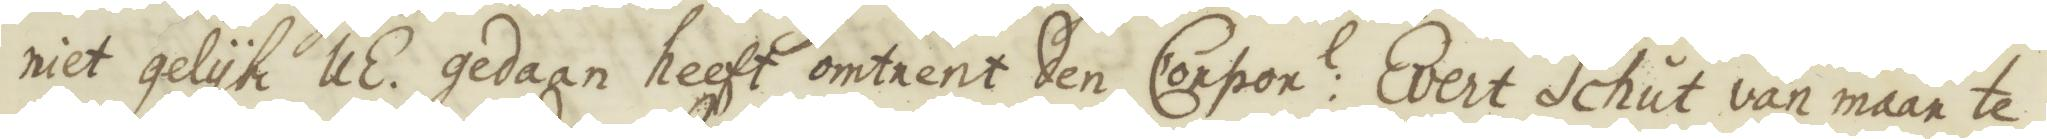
niet gelijk UE. gedaan heeft omtrent den Corpor:l Evert Schut van maar te
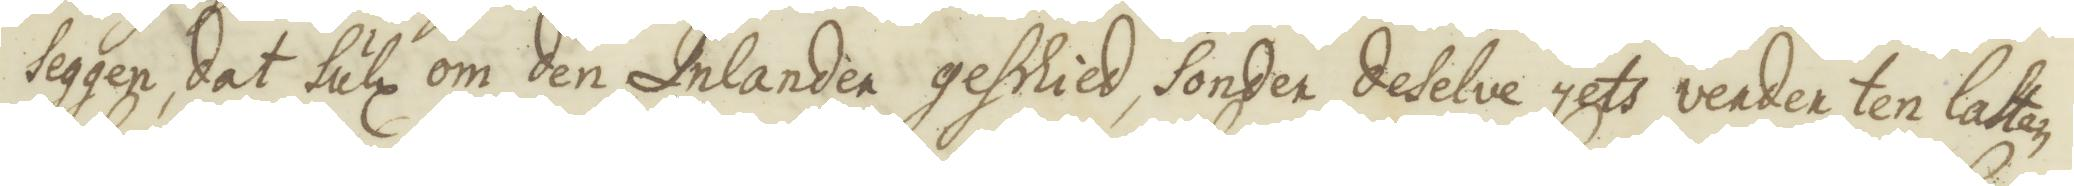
seggen, dat sulx om den Jnlander geschied, sonder deselve jets verder ten lasten
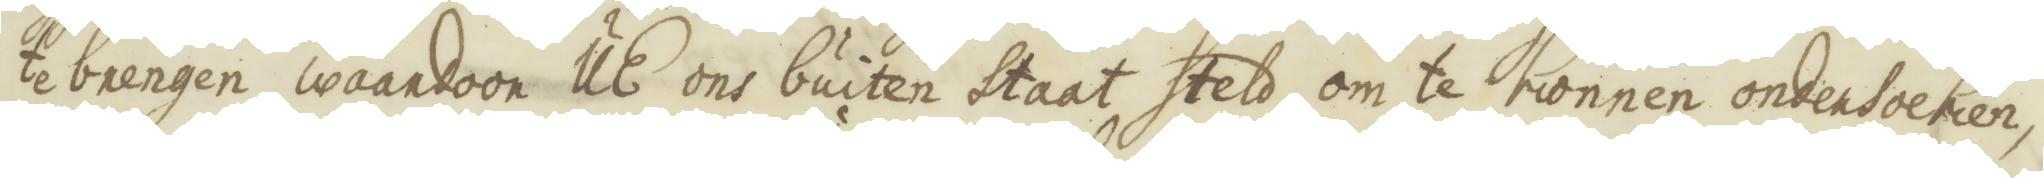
te brengen, waardoor UE ons buijten staat steld, om te konnen ondersoeken,
